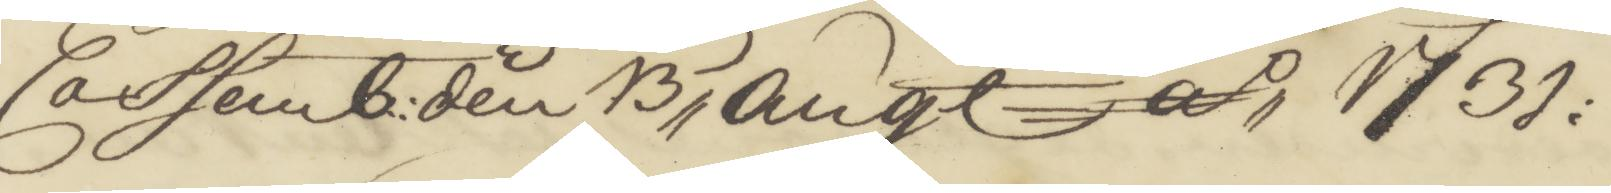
Cassemb:r den 13„' aug= a„o 1731:
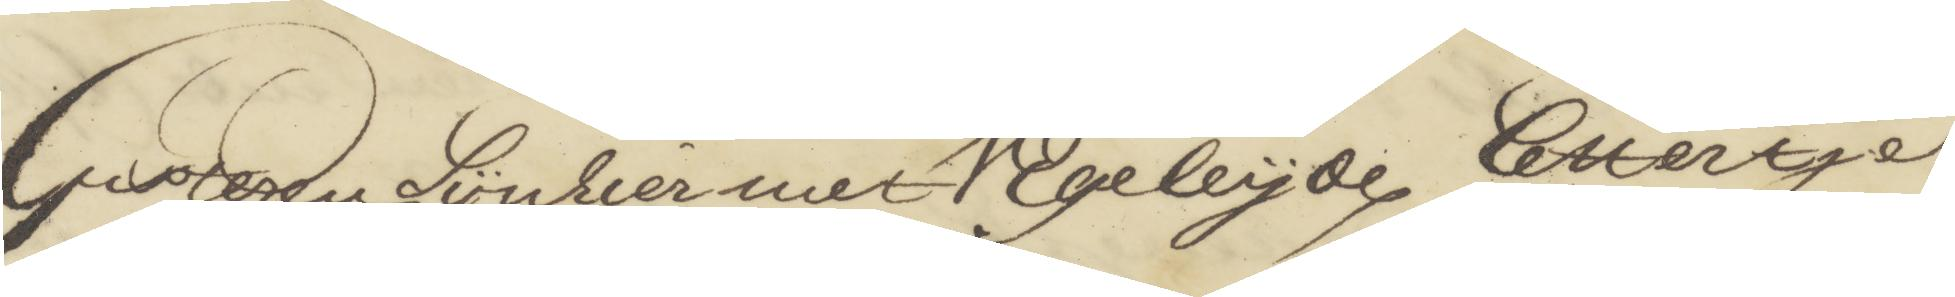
Gisteren Sijn hier met VE geleijde lettertje
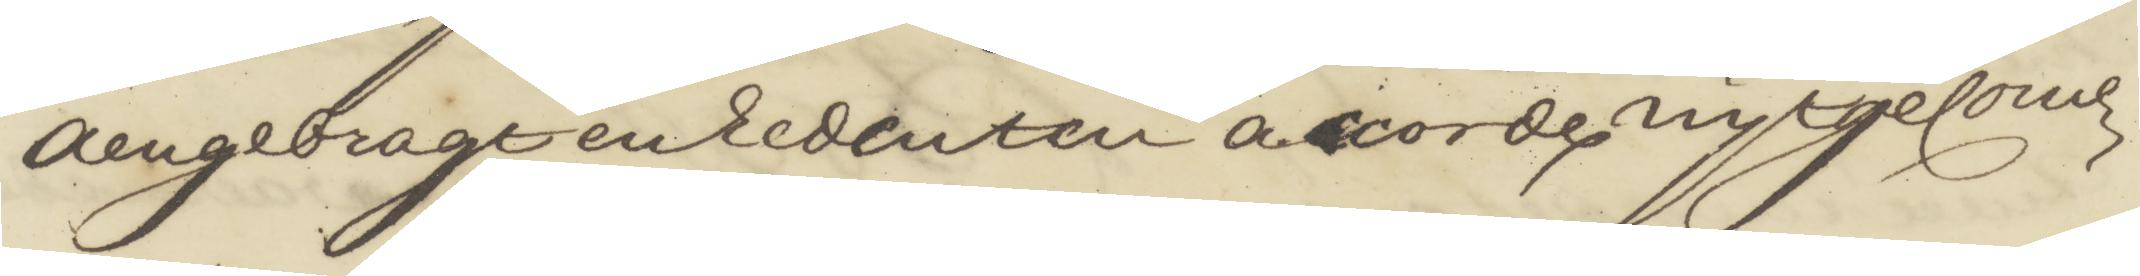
aengebragt en heden ten accorde uijtgecomen
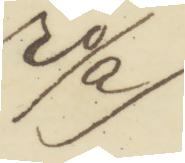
r:o/a /
